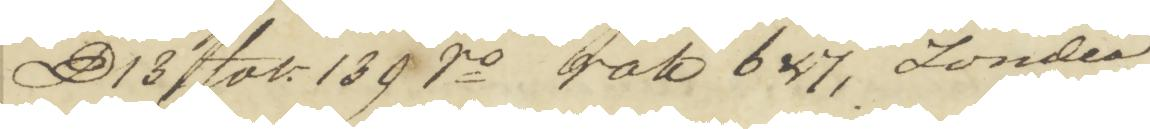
D13 fol. 139 r=o vak 6&7, zonder
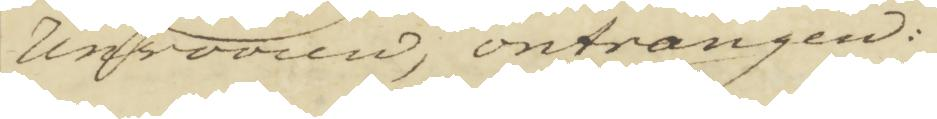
renvooien, ontvangen:
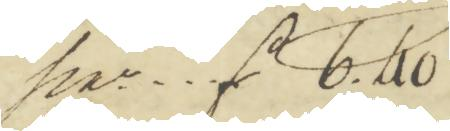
Pr.r . . .ƒ 6.40
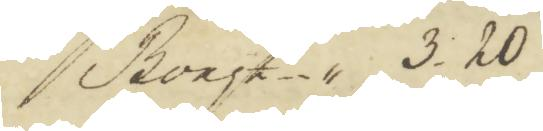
Borgt. . „ 3.20
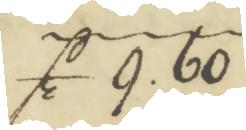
ƒ 9. 60
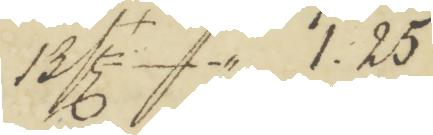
10 /r=t ƒ 1.25
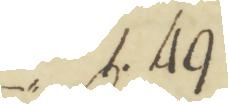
„ 1.49
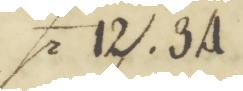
ƒ 12.34
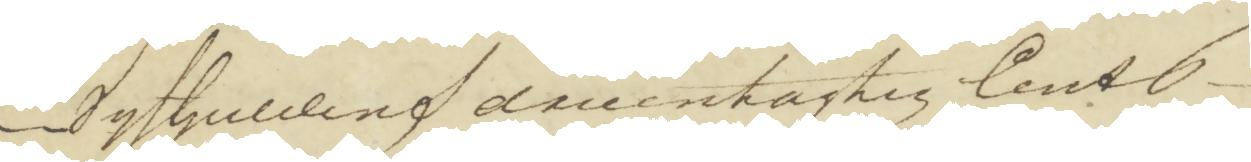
Vyf Guldens drieentagtig Cents
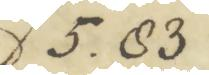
ƒ5.83
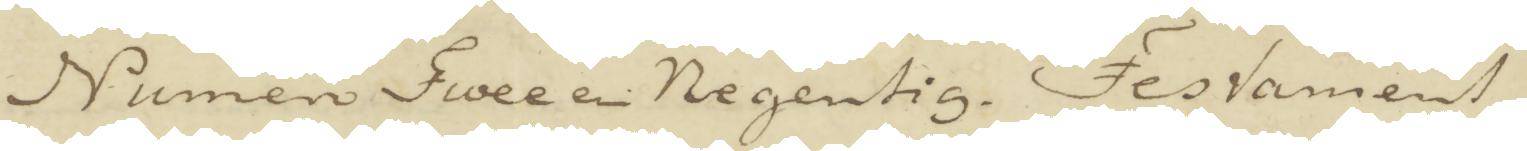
Numero Twee en Negentig. Testament.
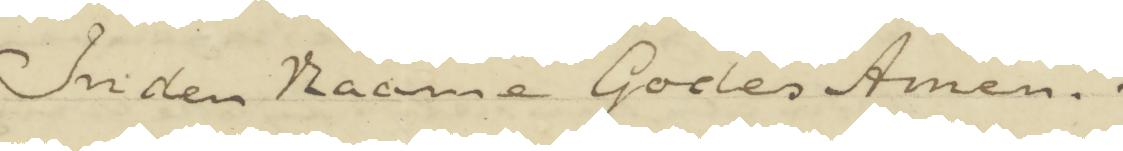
In den Naame Godes Amen.
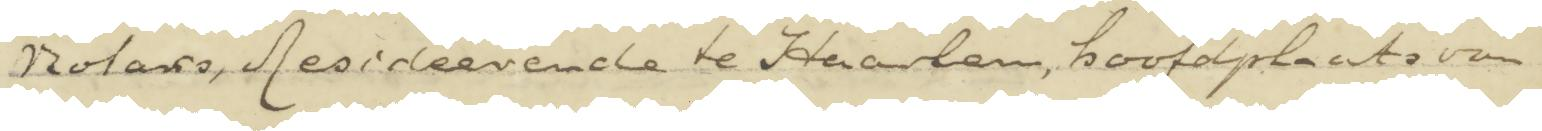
Notaris Resideerende te Haarlem, hoofdplaats van
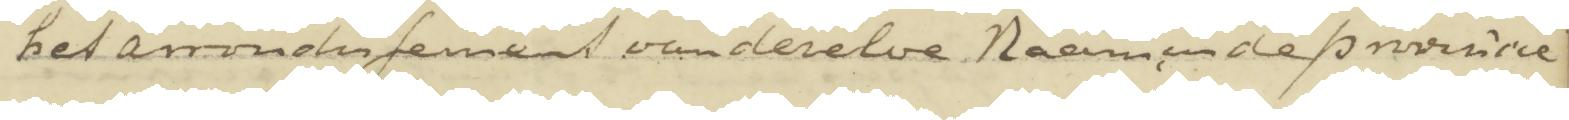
het arrondissement van dezelve Naam, in de provincie
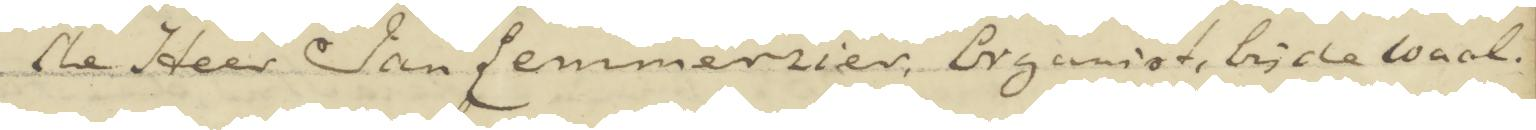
te Heer Jan Lemmerzier, Organist, bij de waal,
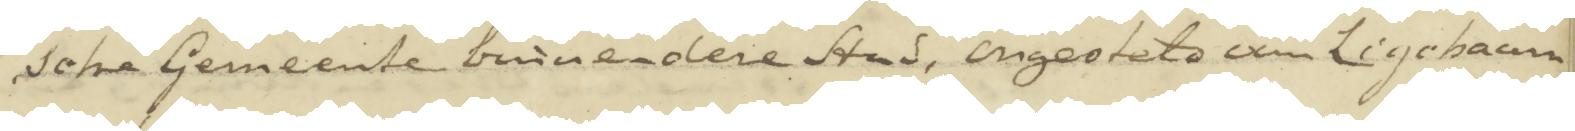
,sche Gemeente binnen deze Stad, ongesteld van Ligchaam
